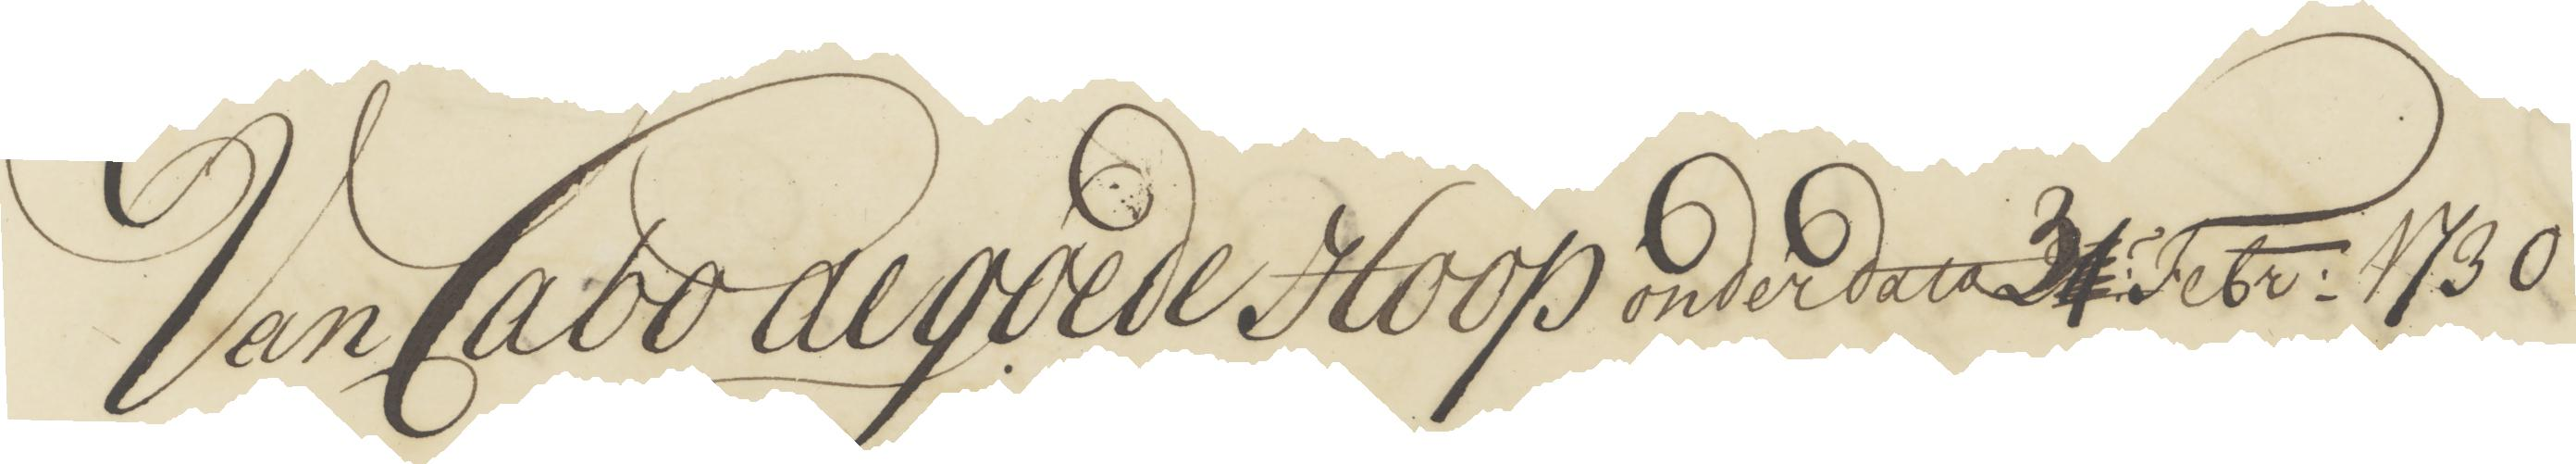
Van Cabo de goede Hoop onder dato 34:' Febr: 1730
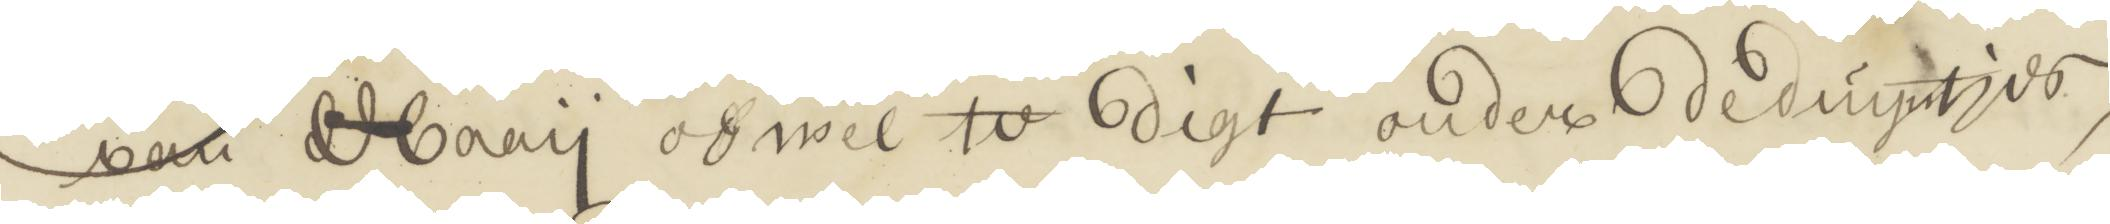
van debaaij ofwel te digt onder de duyntjes
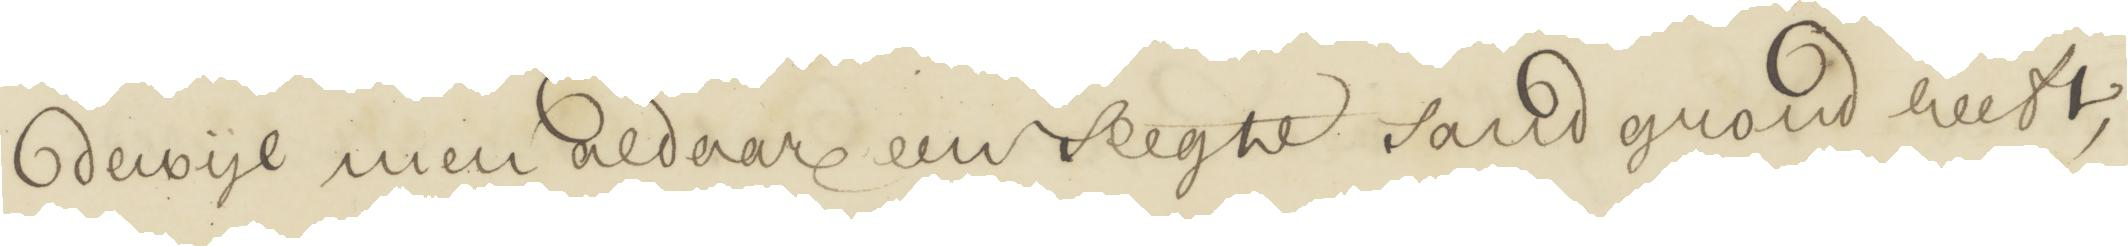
dewijl men aldaar een slegte sand grond heeft,
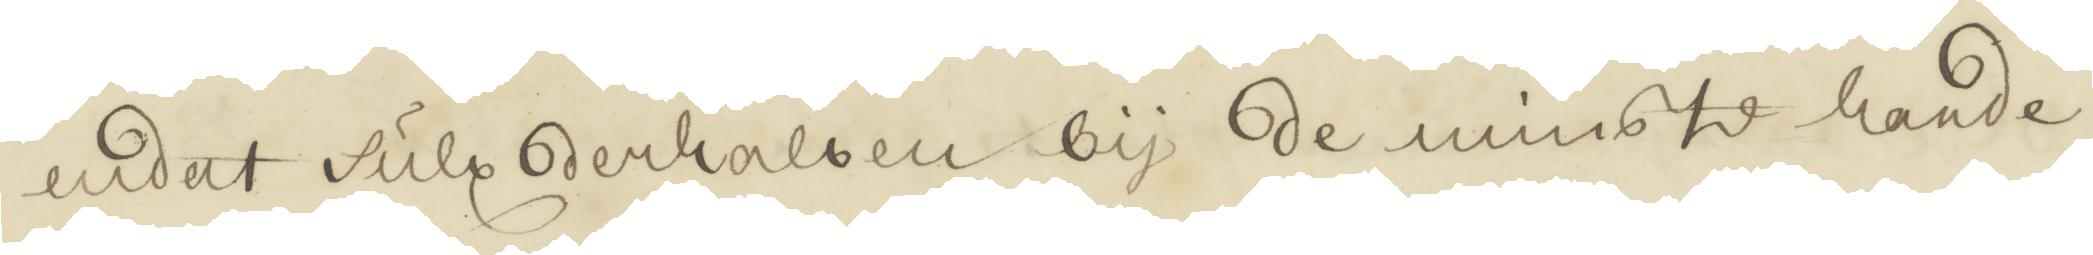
en dat sulx derhalven bij de minste harde
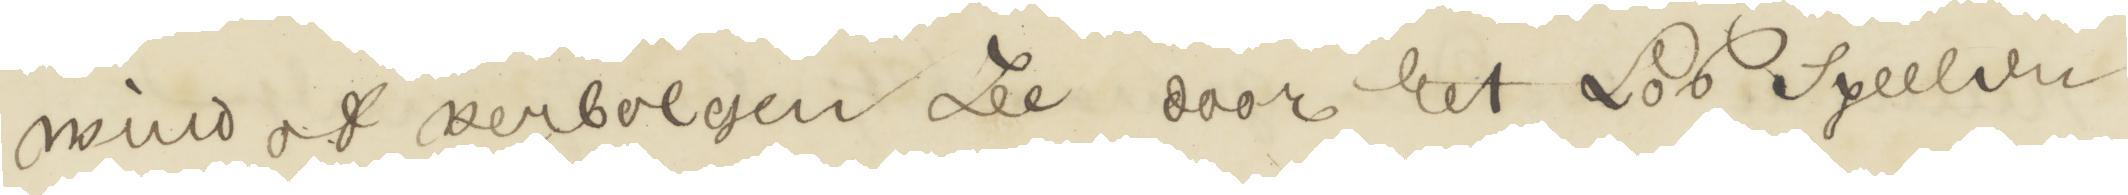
wind of verbolgen zee door het Los speelen
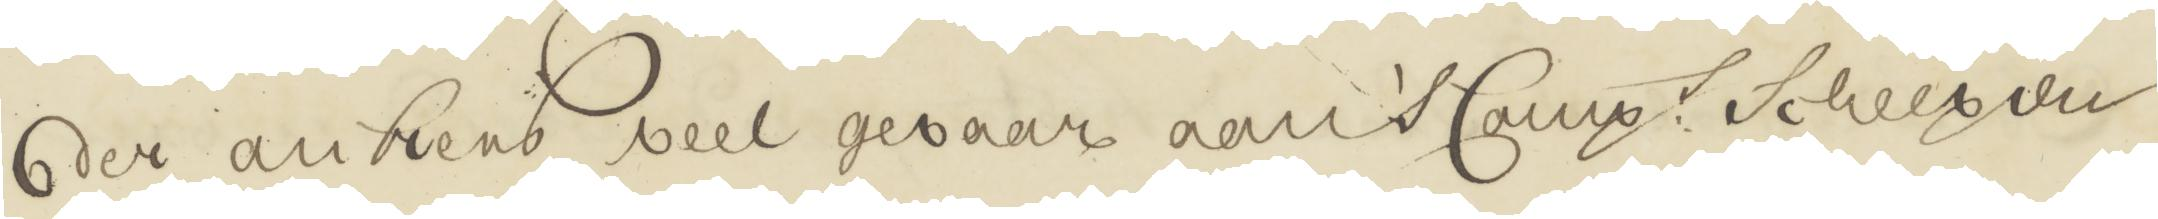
der ankers veel gevaar aan ’s Comp:s scheepen
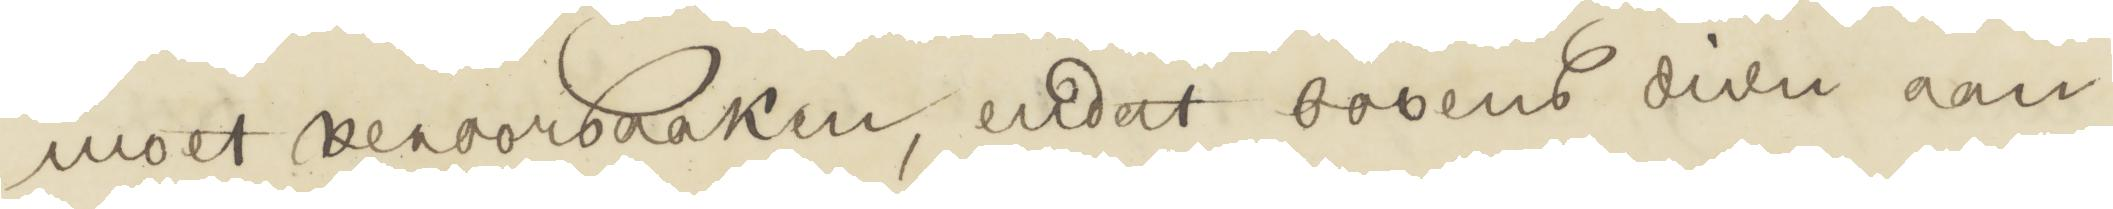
moet veroorsaaken, en dat bovens dien aan
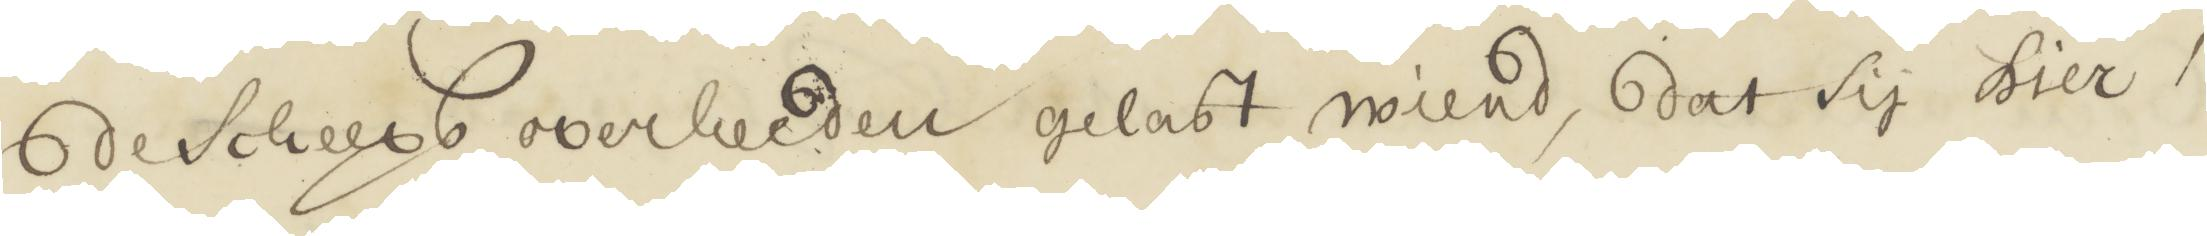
de scheeps overheeden gelast wierd, dat sij hier
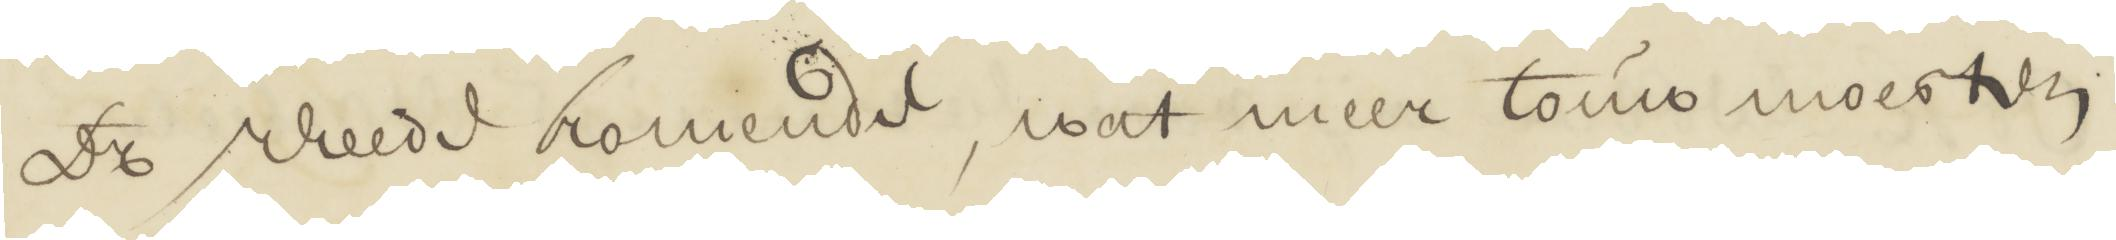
ter rheede komende, wat meer touw moesten
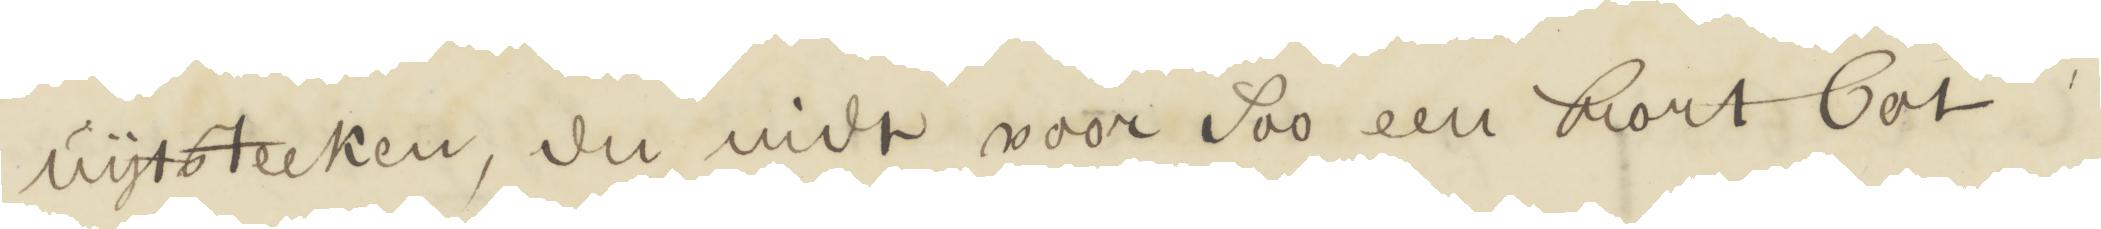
uijtsteeken, en niet voor soo een kort bot
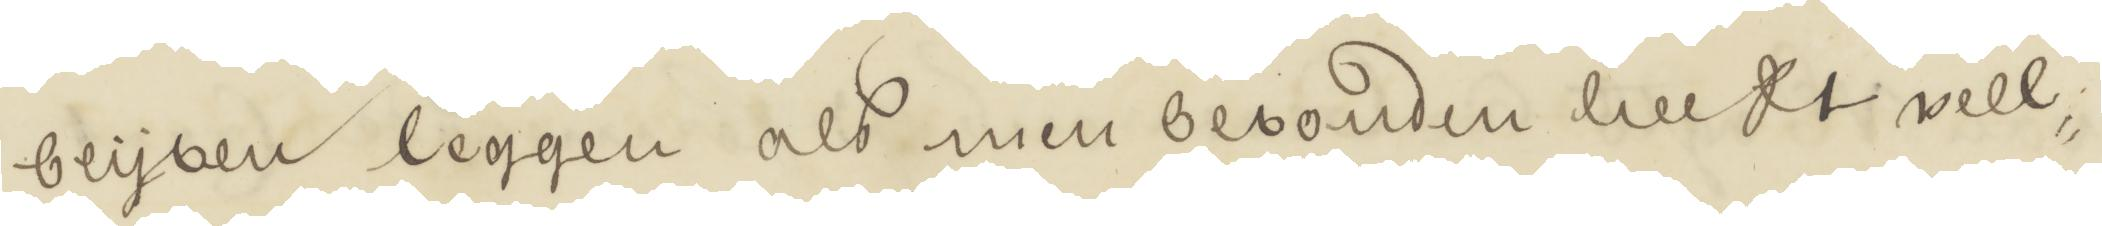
blijven leggen als men bevonden heeft veel„
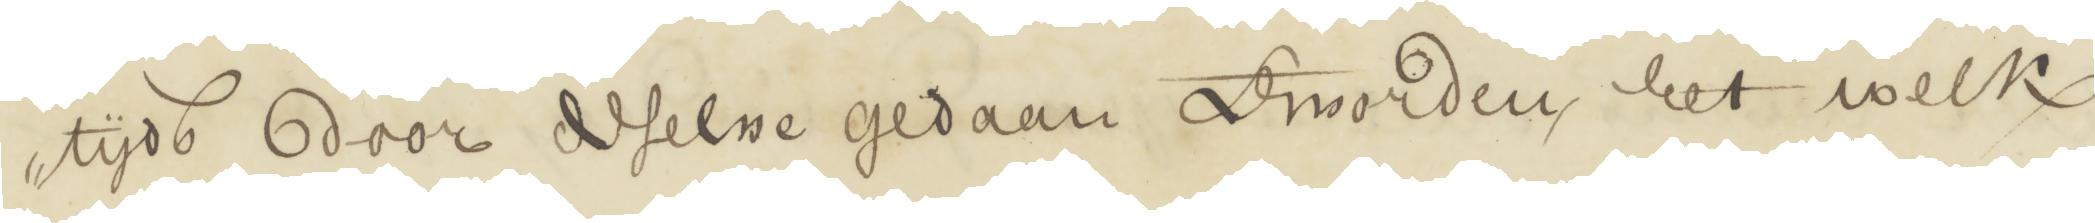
„tijds door deselve gedaan teworden, het welk
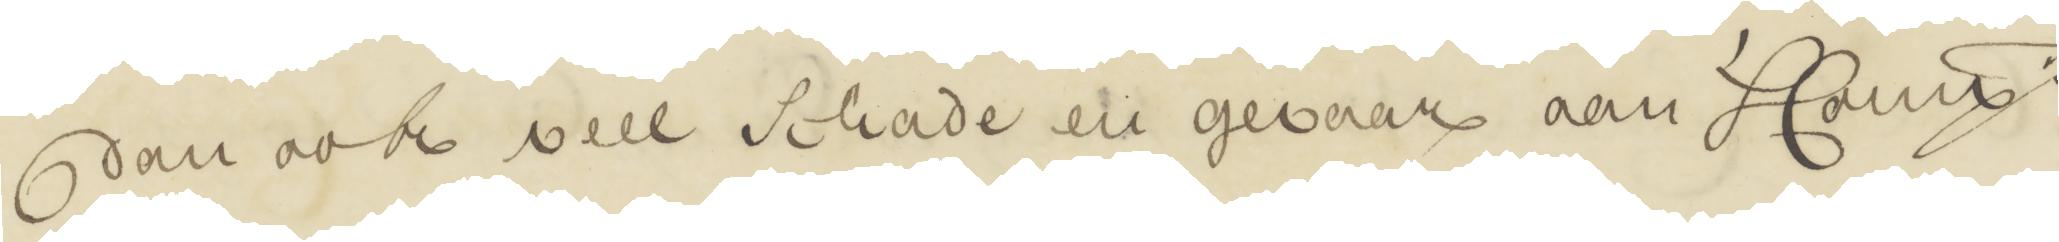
dan ook veel schade en gevaar aan 'sComp:s
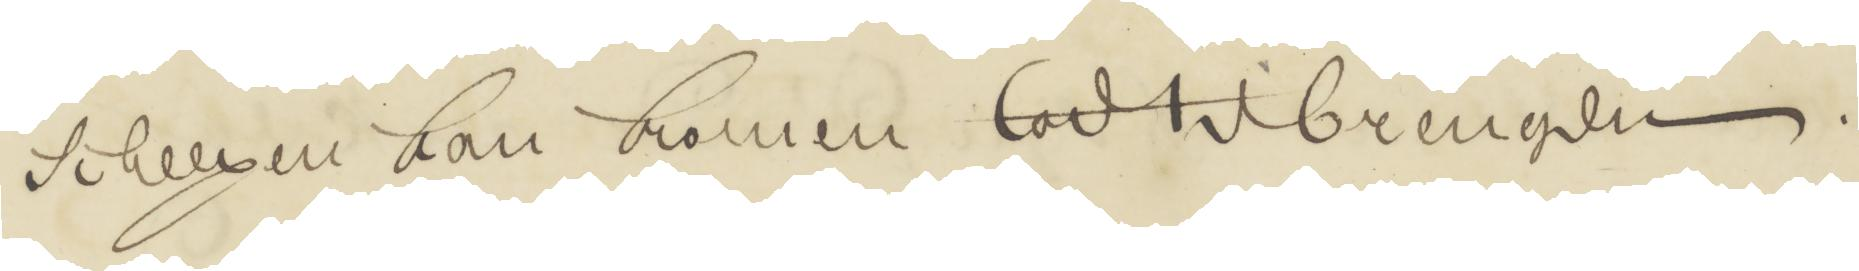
scheepen kan komen toetebrengen
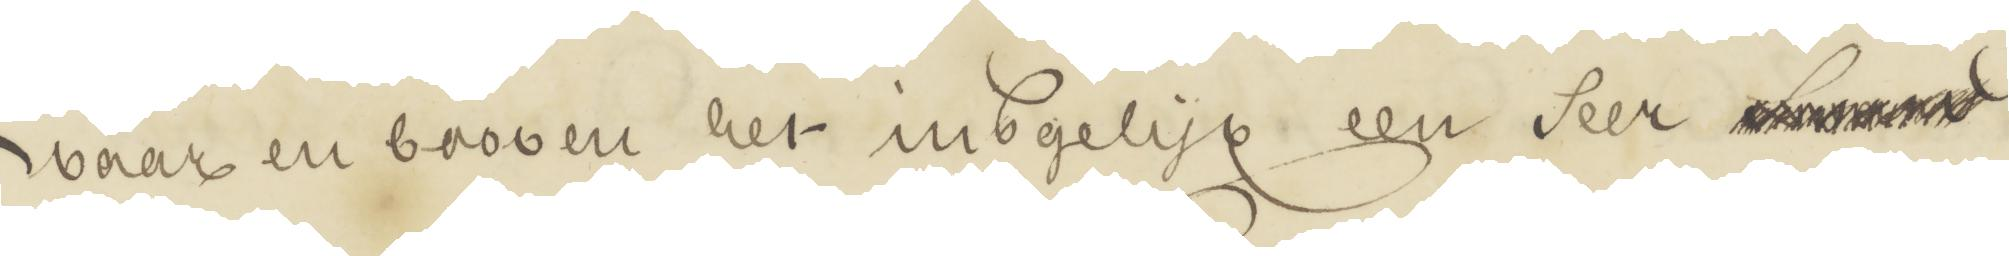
waar en booven het insgelijx een seer sware
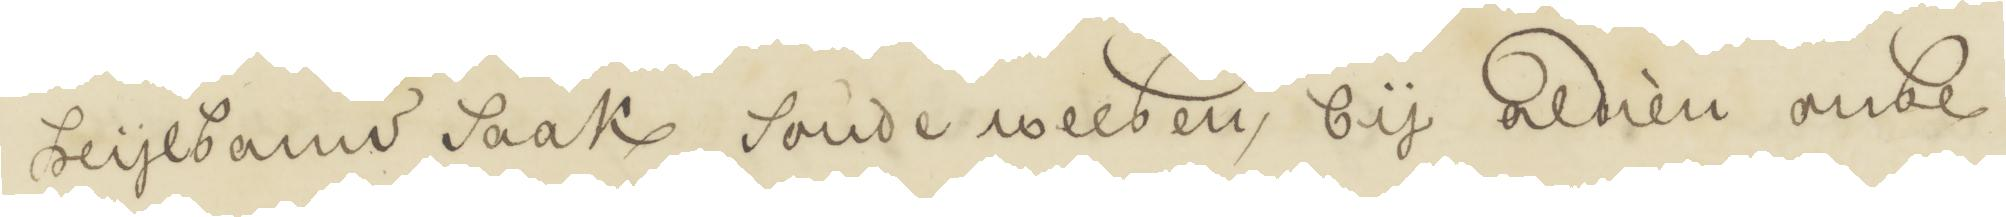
heijlsame saak soude weesen, bij aldien onse
